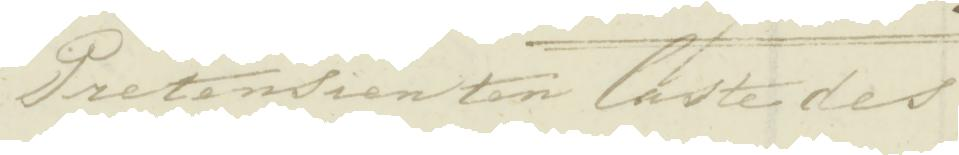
Pretensien ten laste des
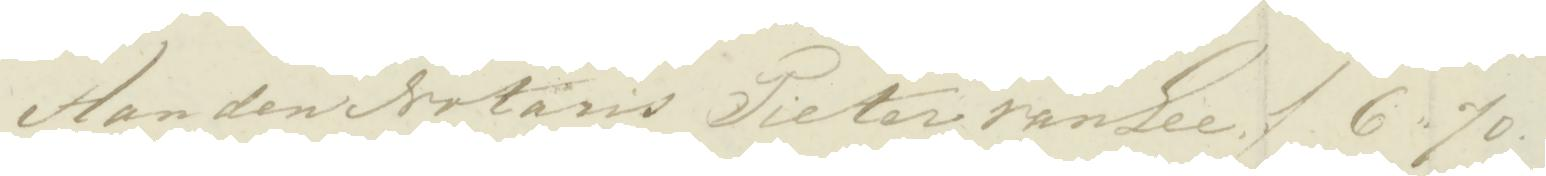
Aan den Notaris Pieter van Lee. ƒ. 6„70.
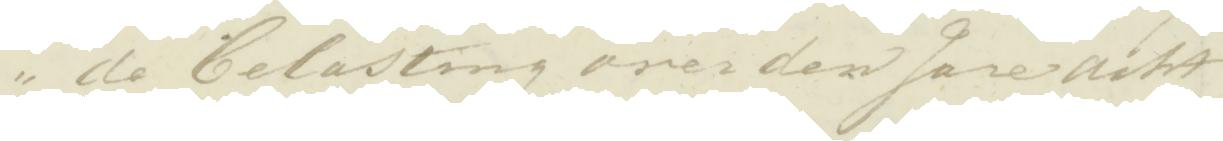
„de belasting over den Jare acht
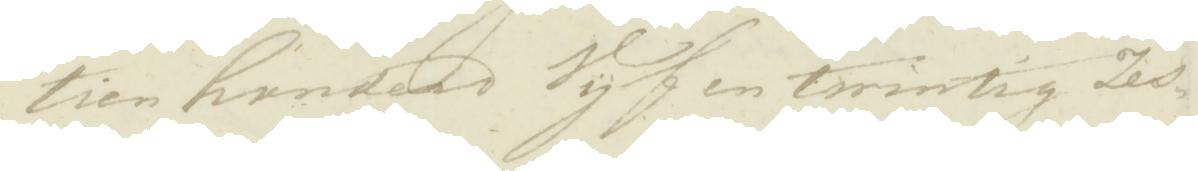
tien honderd Vijf en twintig zes„
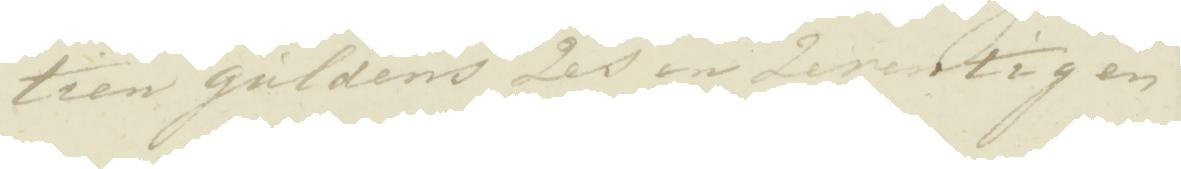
tien guldens zes en zeventig en
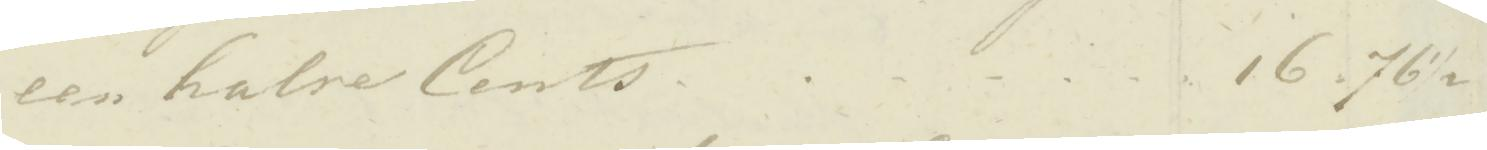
een halve Cents . . . . . . . 16.76½
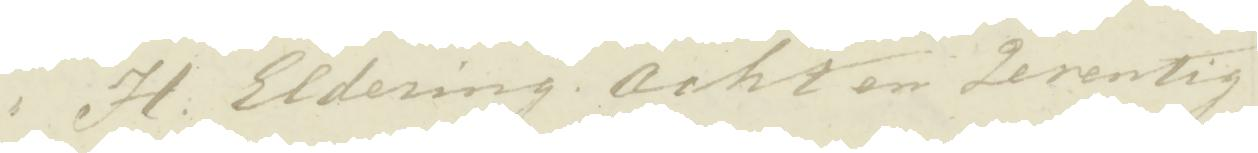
„ H: Eldering acht en zeventig
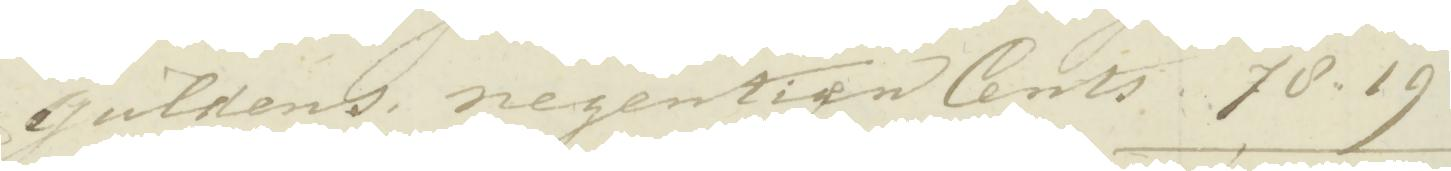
guldens, negentien Cents . 78„19
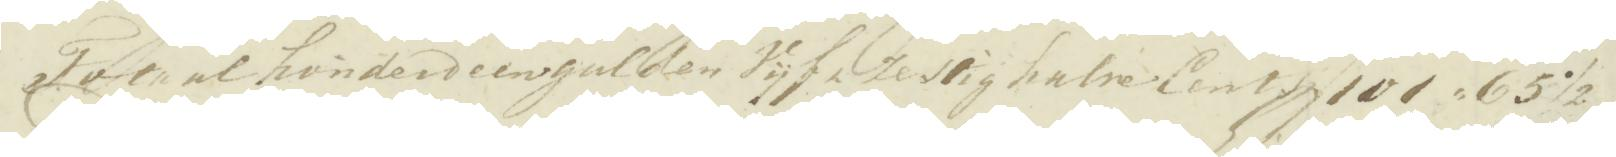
Totaal honderdeen gulden Vijf n zestig halve Cents f 101„65½
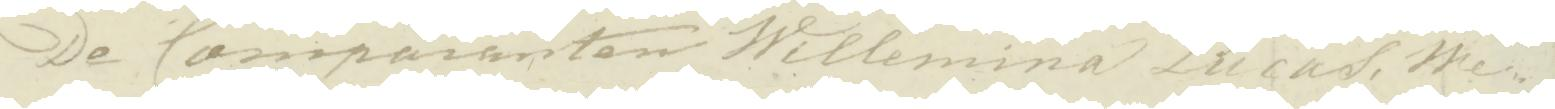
De Comparanten Willemina Lucas, we„
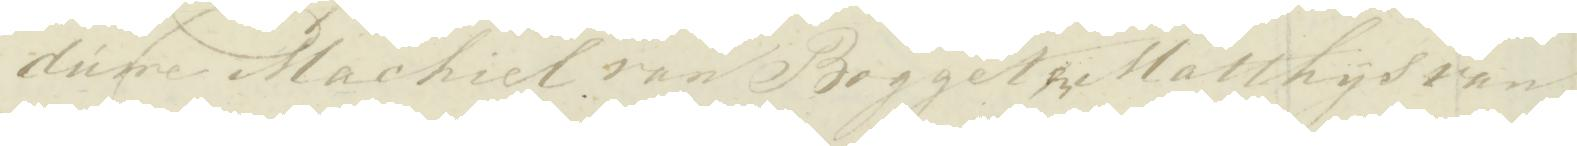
duwe Machiel van Bogget, Matthijs van
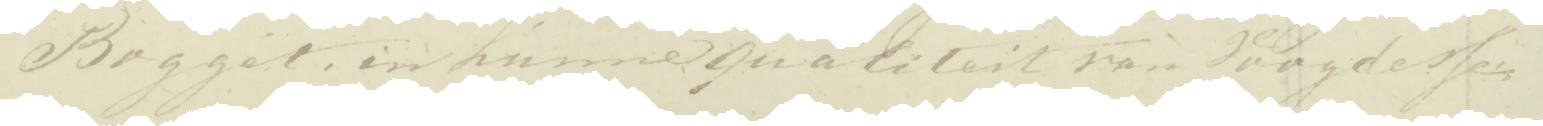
Bogget, in hunne qualiteit van Voogdessen
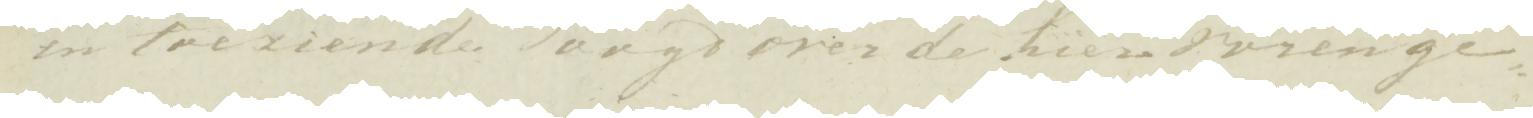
en toeziende voogd over de hier voren ge„
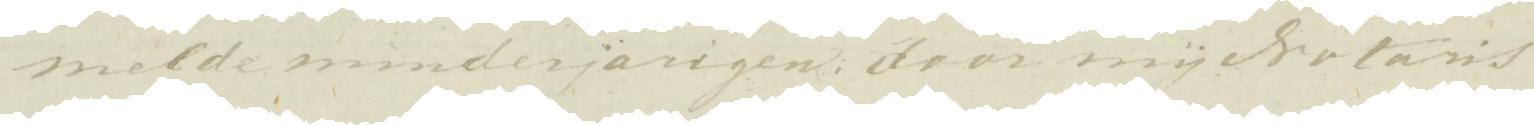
melde minderjarigen: door mij Notaris
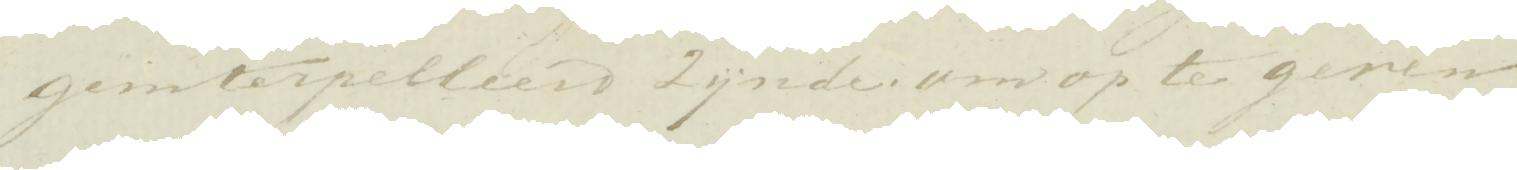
geinterpelleerd zijnde om op te geven
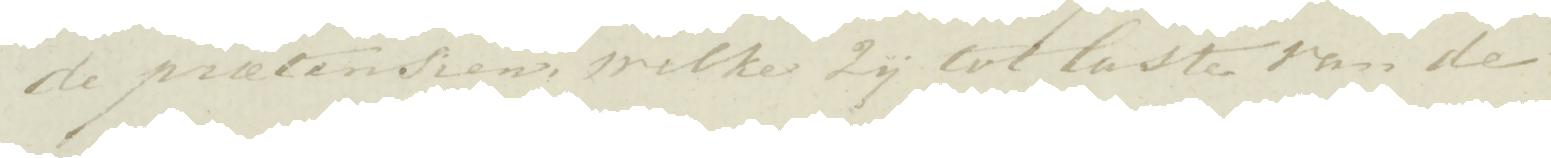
de pretensien, welke zij tot laste van de
